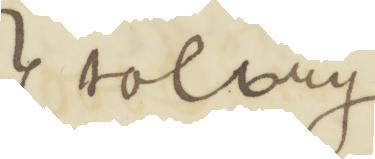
tolvrij
